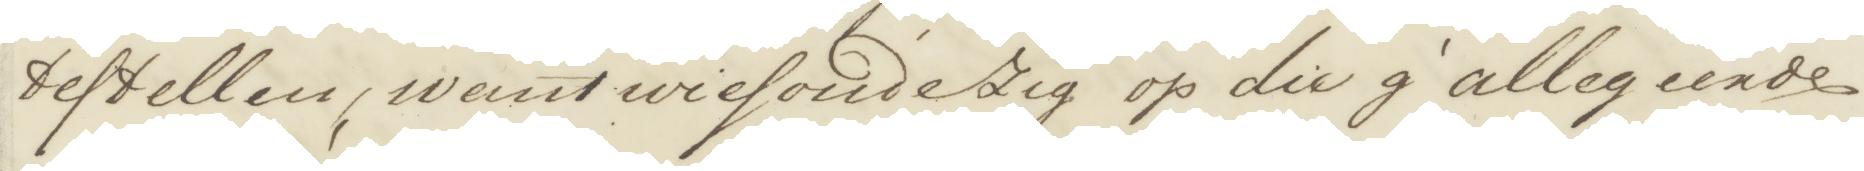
testellen, want wie soude zig op die g’allegeerde
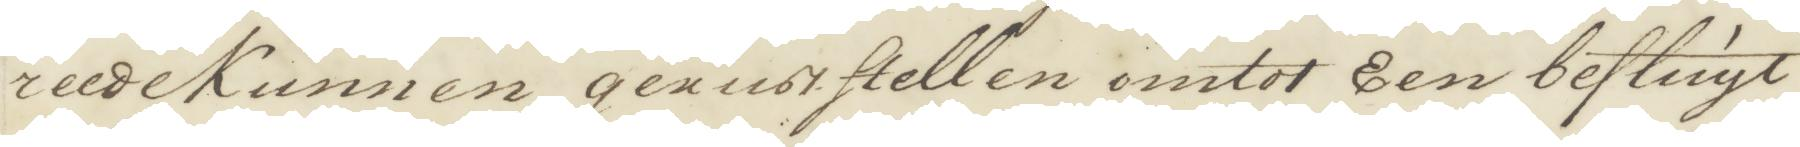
reede kunnen geruststellen om tot Een besluyt
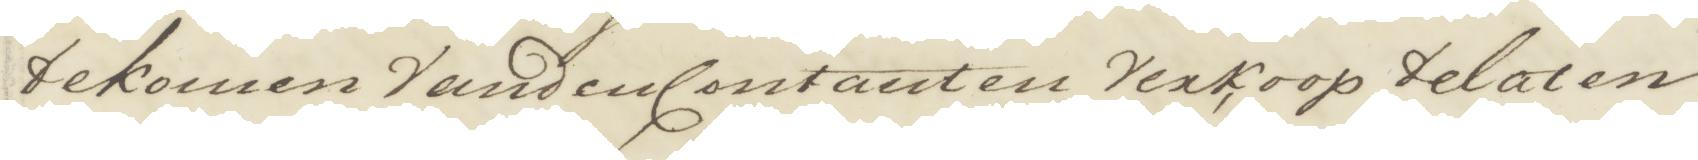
tekomen van den Contanten verkoop telaten
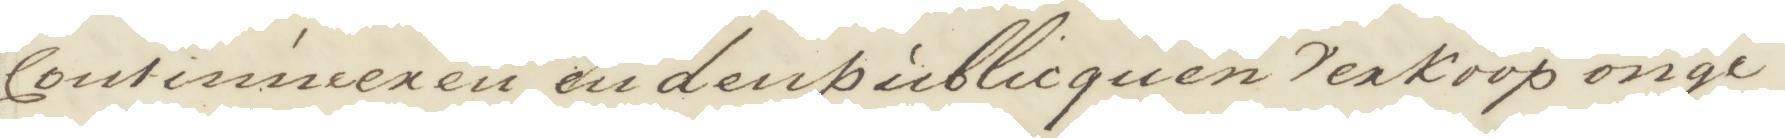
continueeren en den publicquen verkoop onge
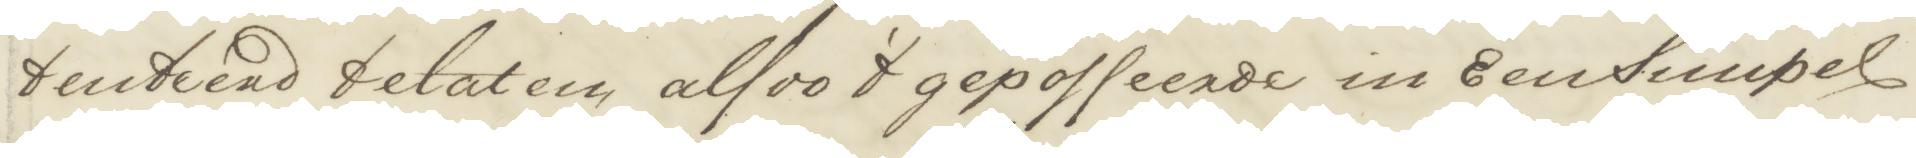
tenteerd telaten, alsoo ’t geposseerde in Een simpel
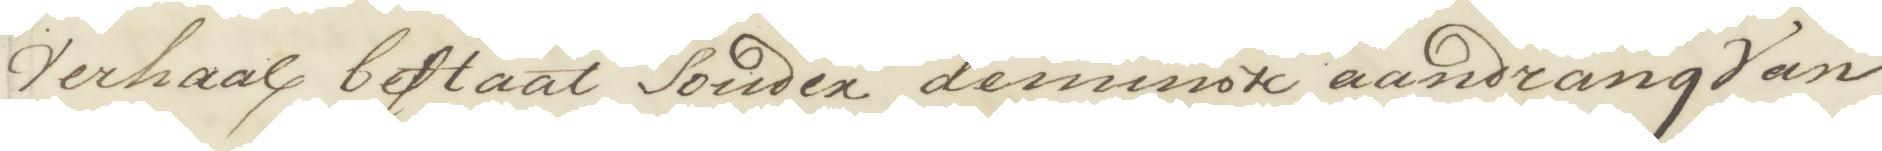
verhaal bestaat sonder de minste aandrang van
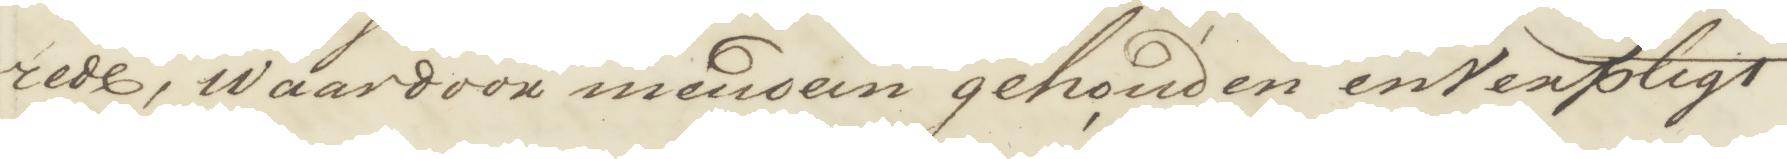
rede, waardoor men dan gehouden en verpligt
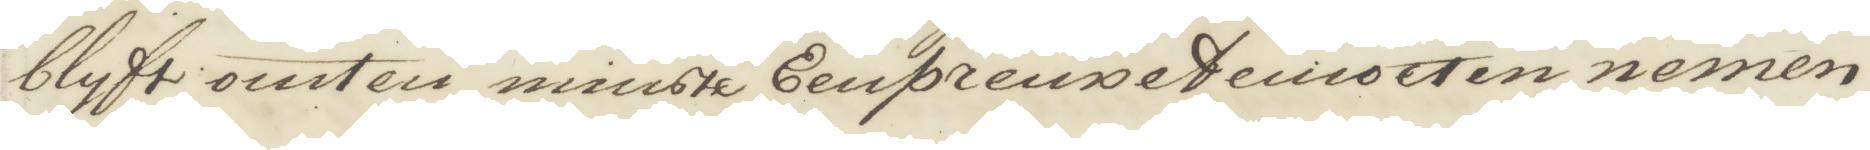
blyft om ten minste Een preuve temoeten nemen
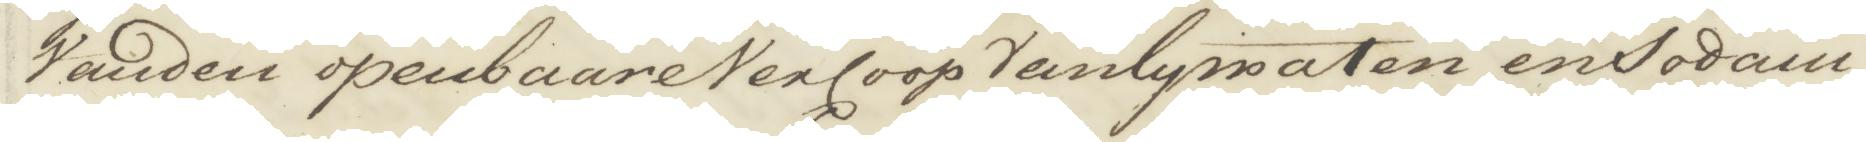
vanden openbaare vercoop van lywaten en sodani
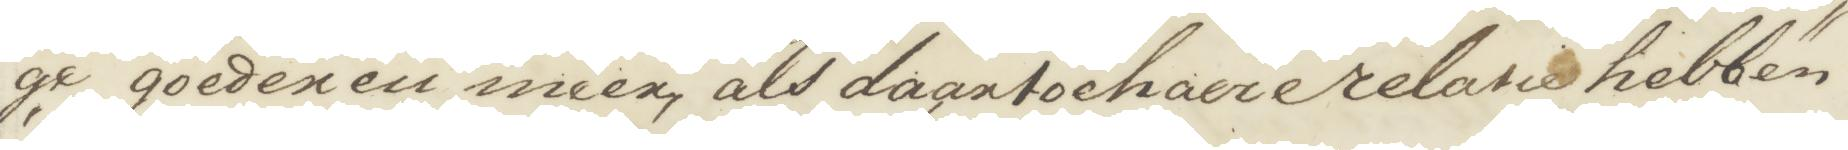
„ge goederen meer, als daartoe haere relatie hebben
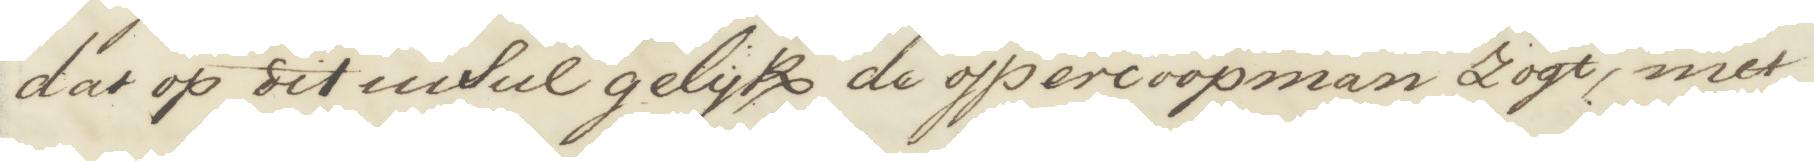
dat op dit insul gelijk de oppercoopman zogt, met
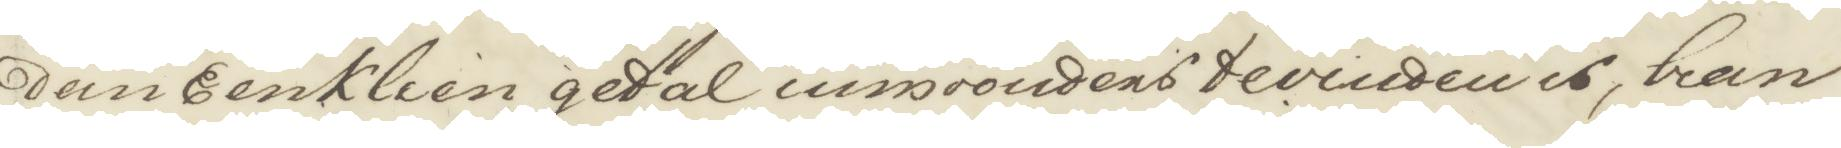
dan Een kleen getal inwoonders tevinden is, kan
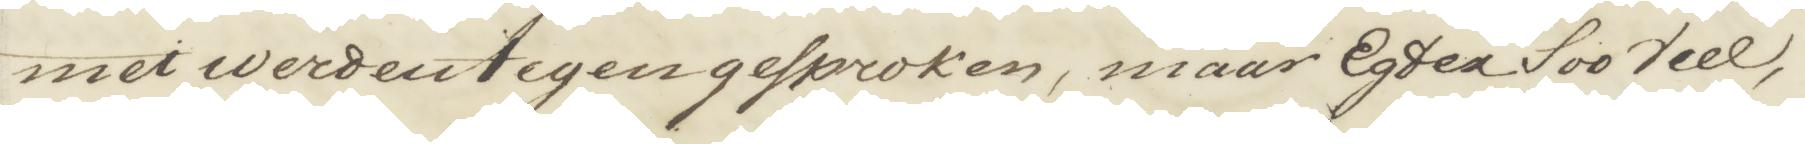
niet werden tegen gesproken, maar Egter soo veel,
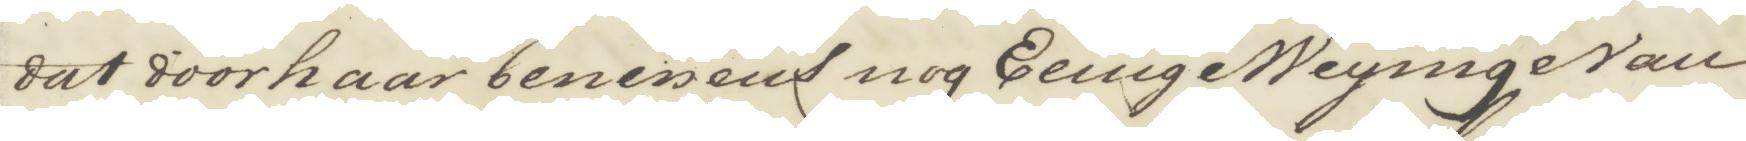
dat door haar benevens nog Eenige Weynige van
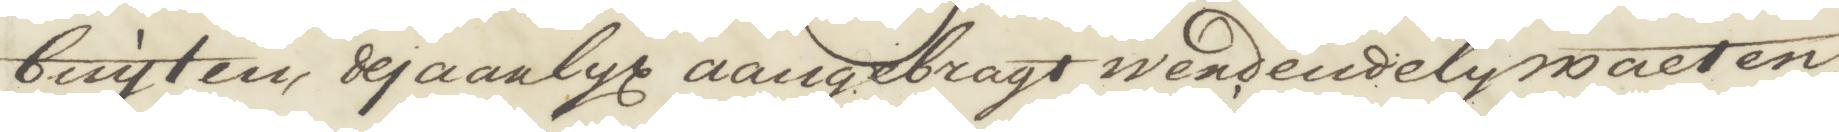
buijten, dejaarlijx aangebragt werdende lijwaeten
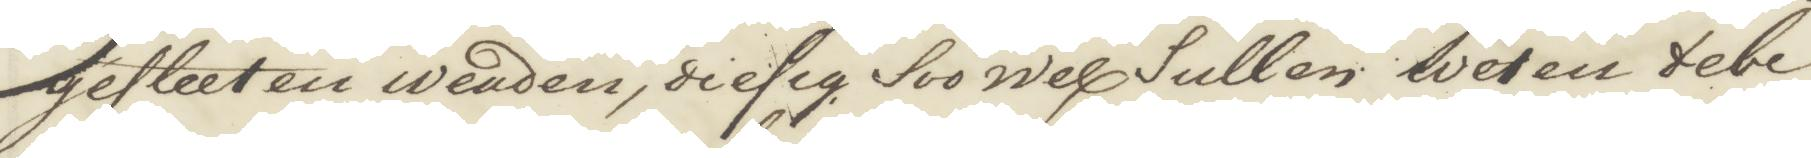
gesleeten werden, die sig soo wel sullen wet en tebe
